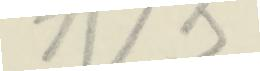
3175
